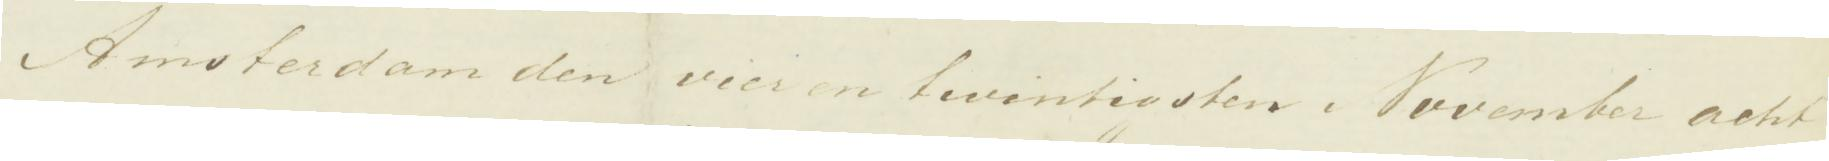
Amsterdam den vier en twintigsten November acht
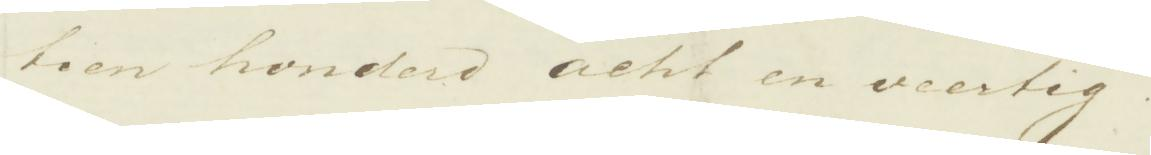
tien honderd acht en veertig.
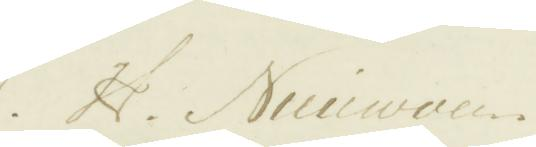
J. H: Nieuwveen
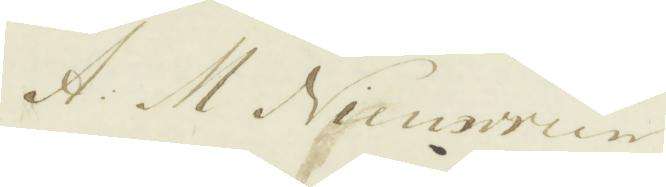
A: M Nieuwveen
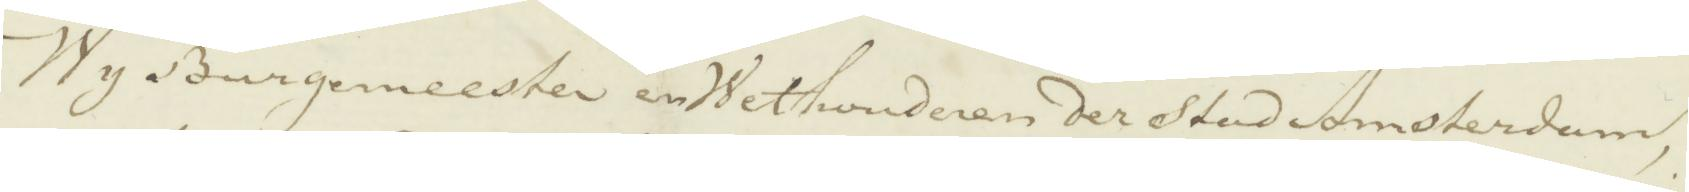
Wy Burgemeester en Wethouderen der stad Amsterdam,
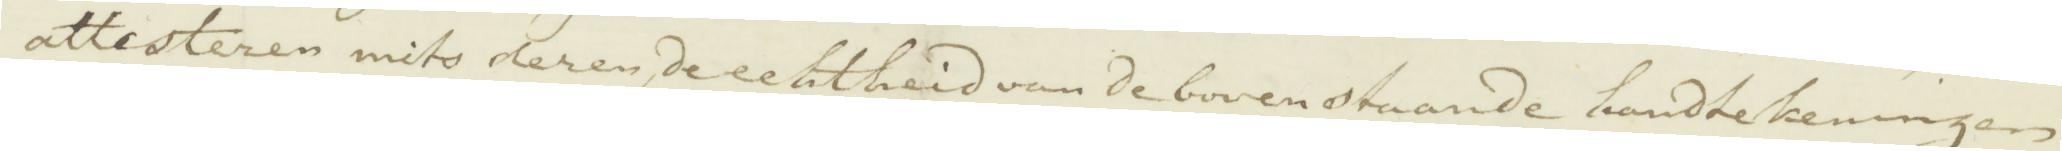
attesteren mits dezen, de echtheid van de bovenstaande handtekeningen
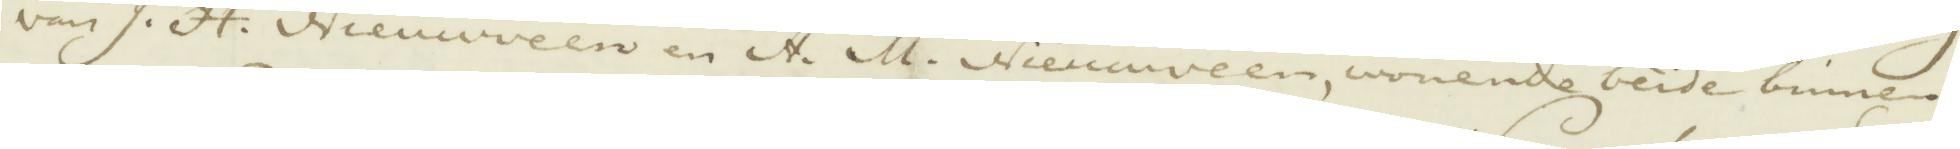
van J. H: Nieuwveen en A. M. Nieuwveen, wonende beide binnen
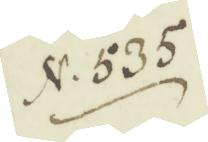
N: 535
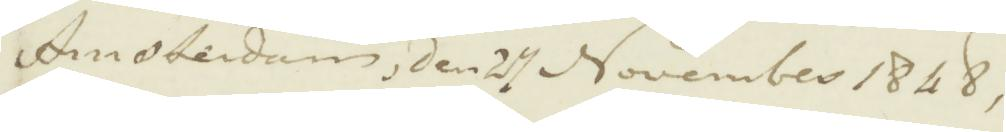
Amsterdam, den 27 November 1848
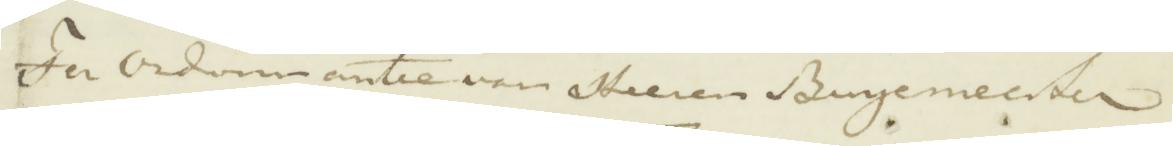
Ter Ordonnntie van Heeren Burgemeester
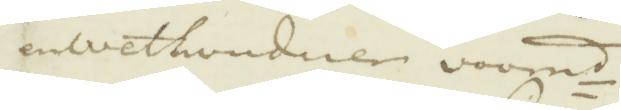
en wethouderen voorn=d
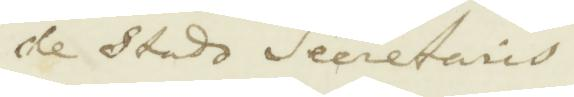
de stads Secretaris
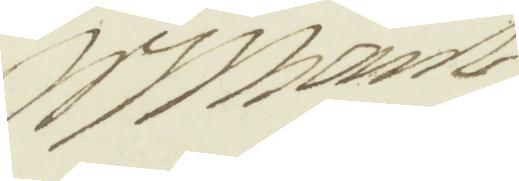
W J Mant
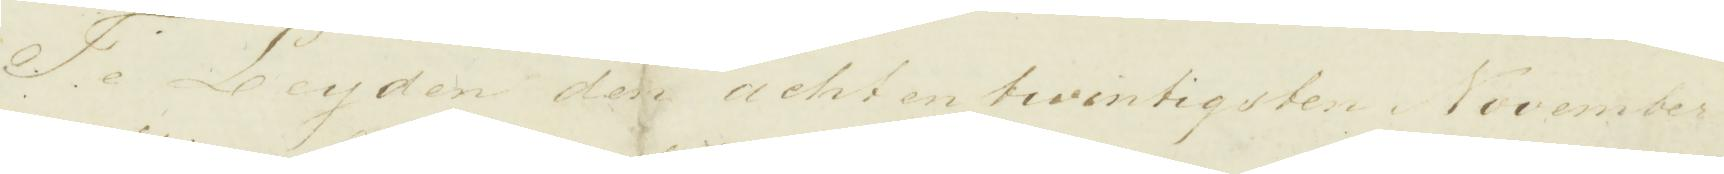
Te Leijden den achtentwintigsten November
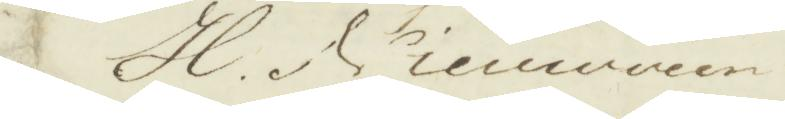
H. Nieuwveen
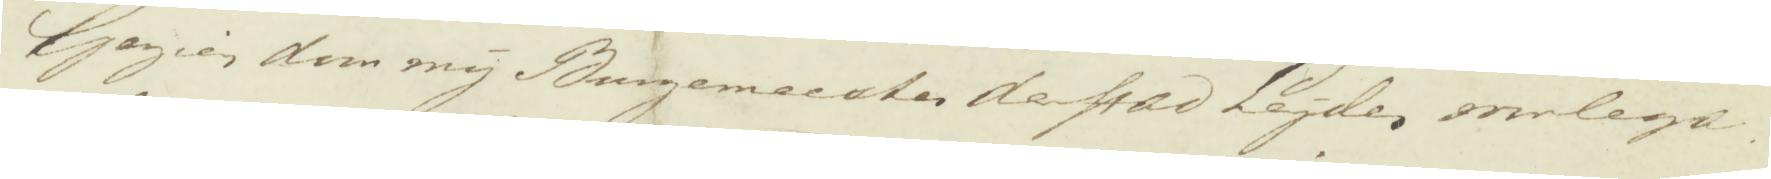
Gezien door mij Burgemeester de stad Leijden voorlega
